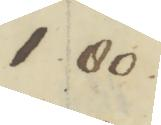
1. 80
